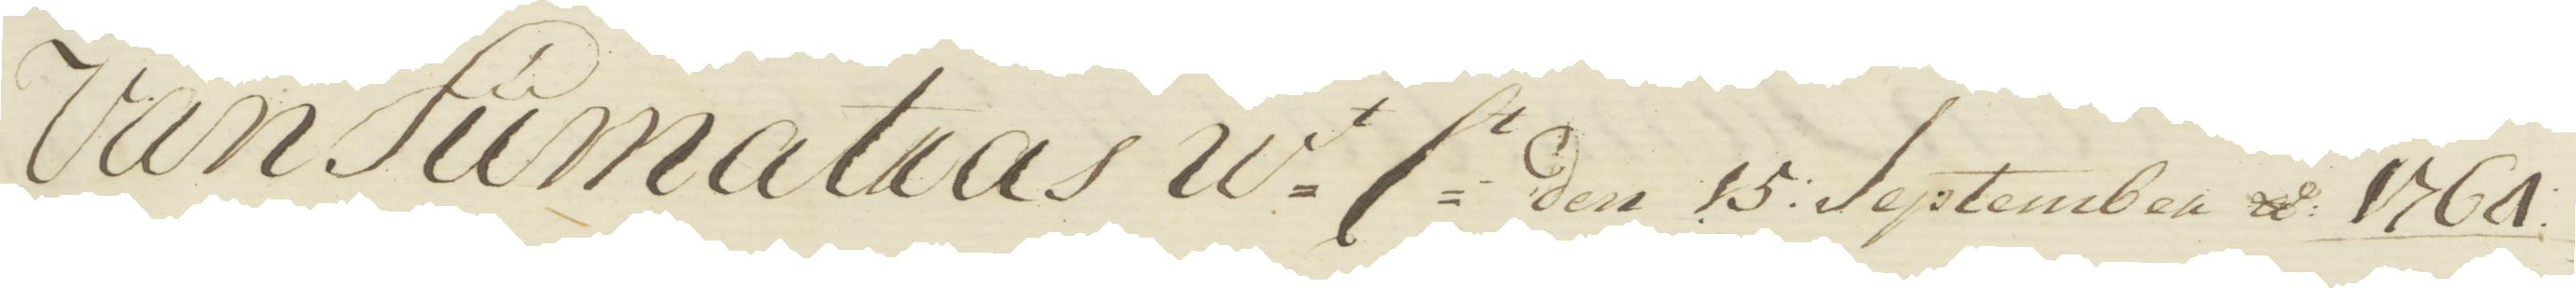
Van Sumatras w=t C=t den 15: September a:o 1764:
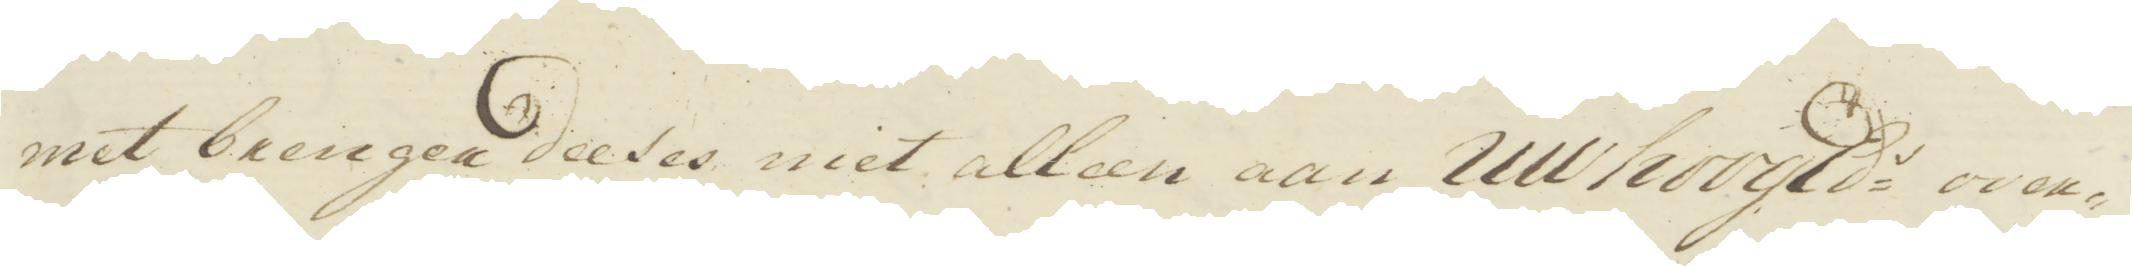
met brengen deeses niet alleen aan uw hoog Ed=s over„
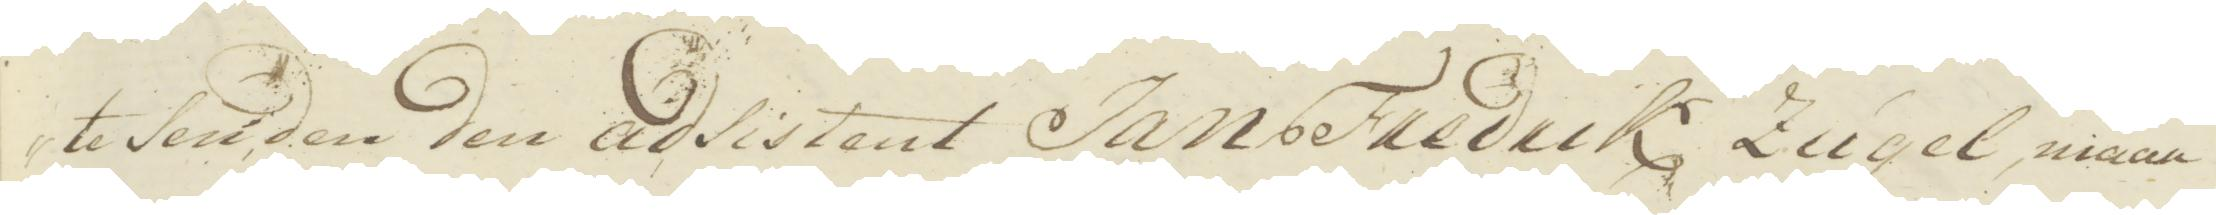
„te senden den adsistent Jans Fredrik Zugel, maar
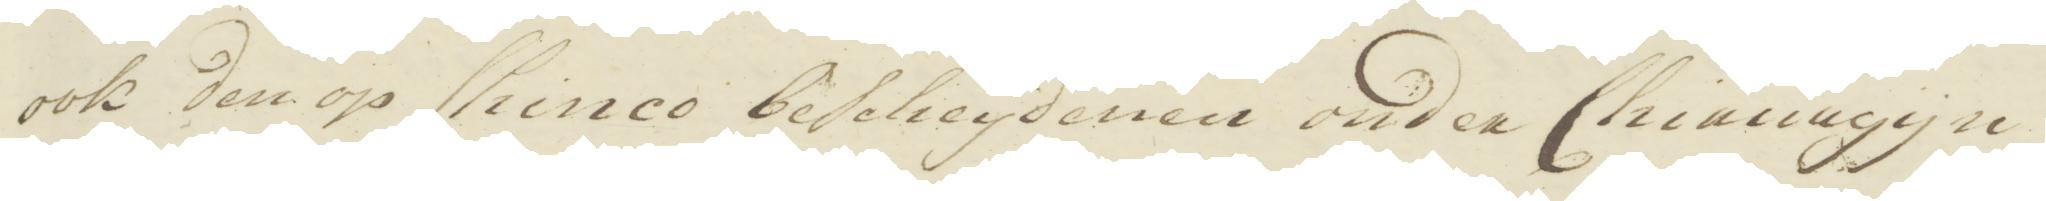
ook den op Chinco bescheydenen onder Chirurgijn
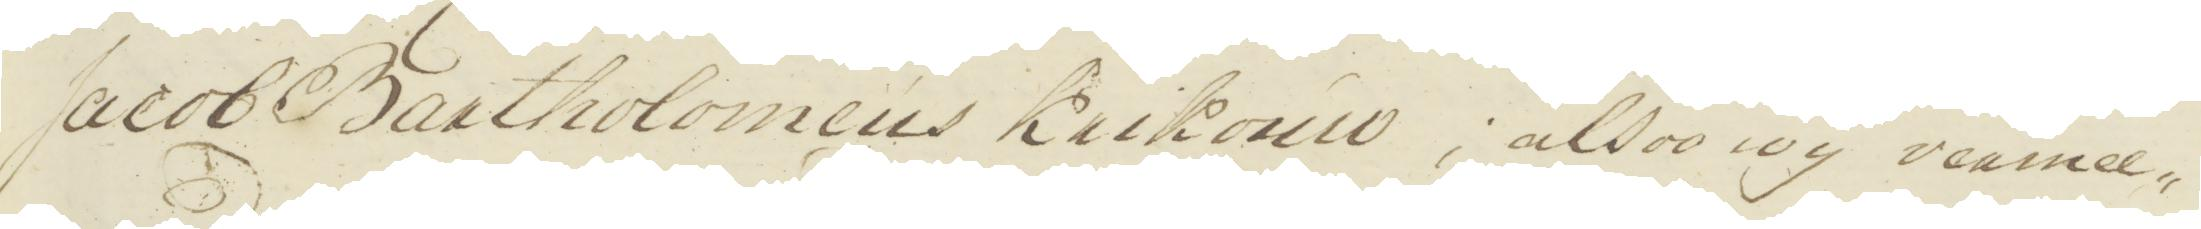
Jacob Bartholomeus krikouw; alsoo wij vermee„
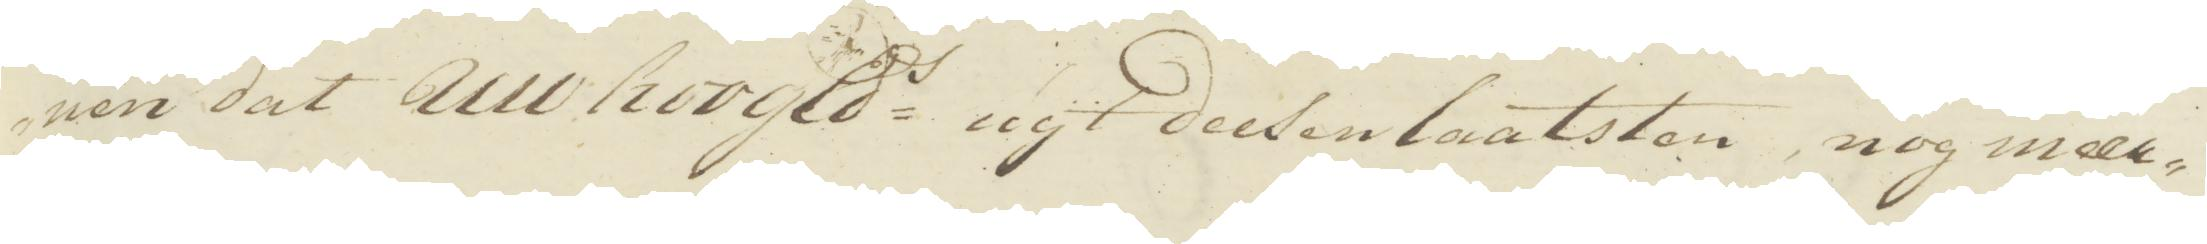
„nen dat uw hoog Ed=s uijt deesen laatsten, nog meer„
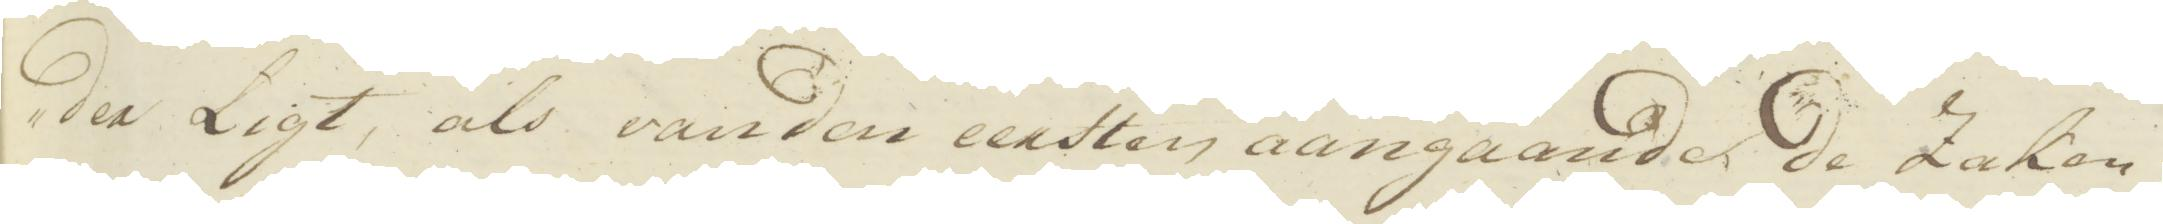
„der Ligt, als van den eersten aangaande, de zaken
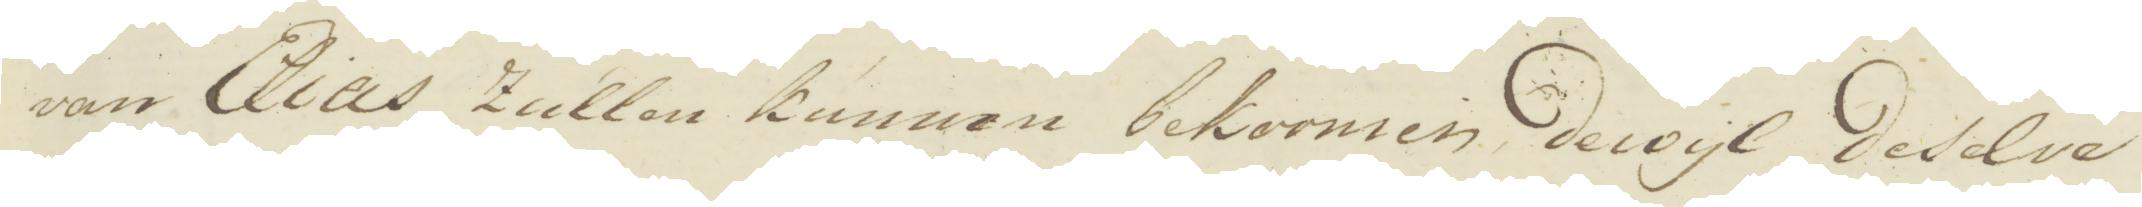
van Elias zullen kunnen bekoomen dewijl deselve
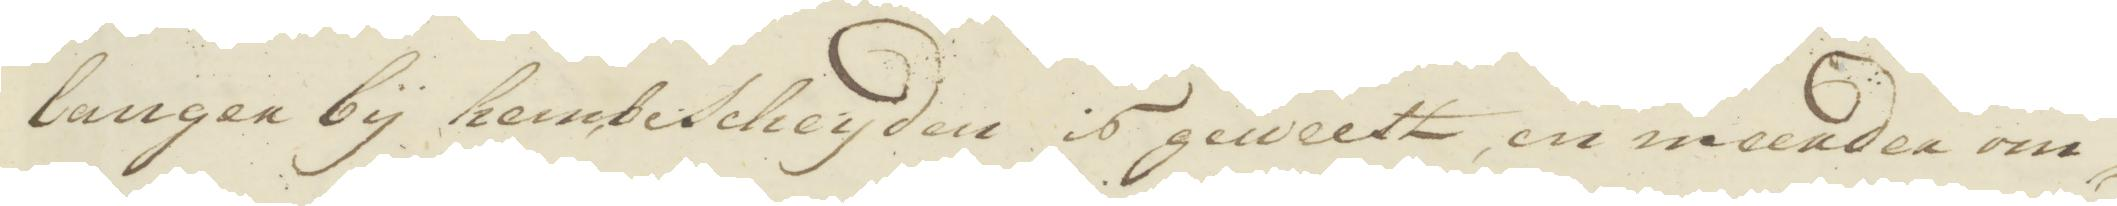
langer bij hem bescheyden is geweest, en meerder om
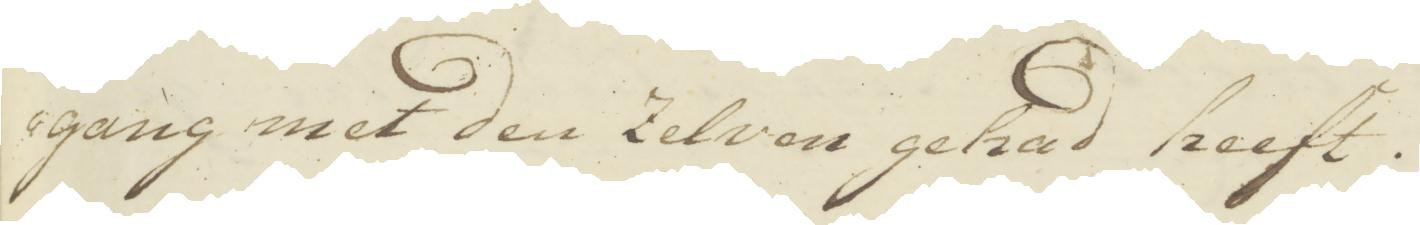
„gang met den zelven gehad heeft.
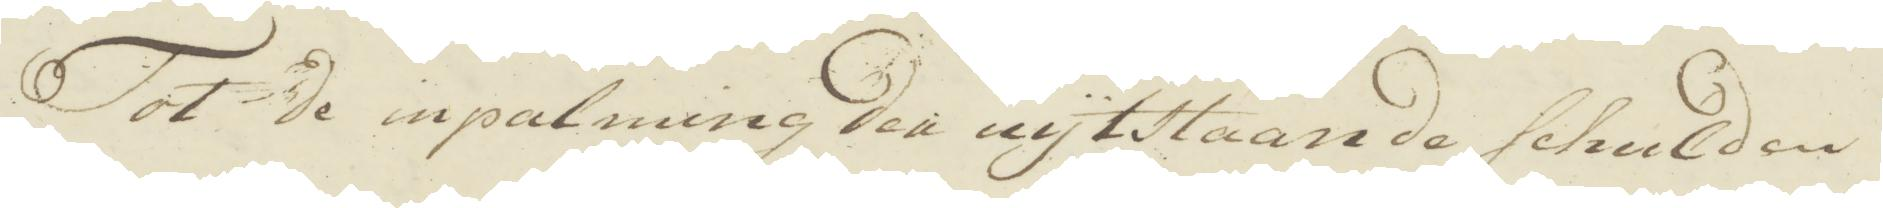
Tot de inpalming der uijtstaande schulden
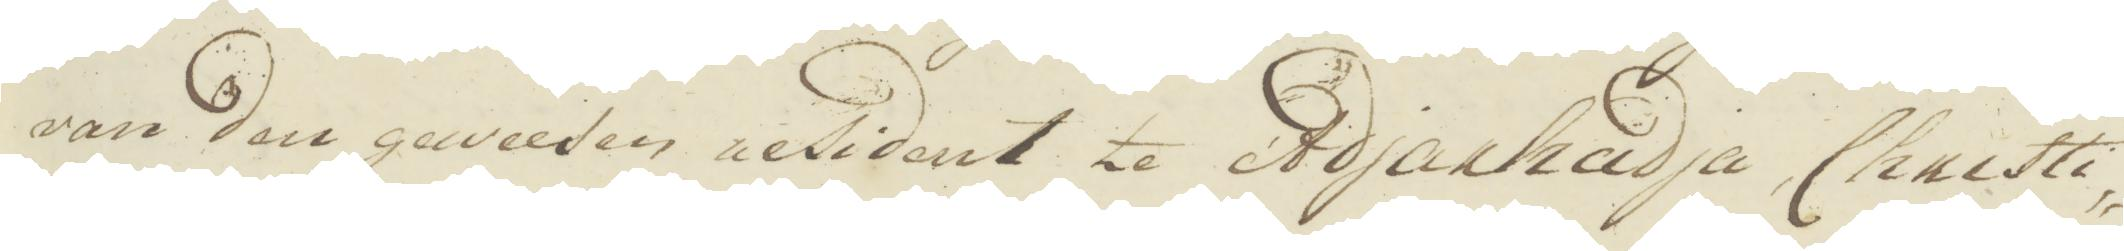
van der geweesen resident te Adjarhadja, Christi„
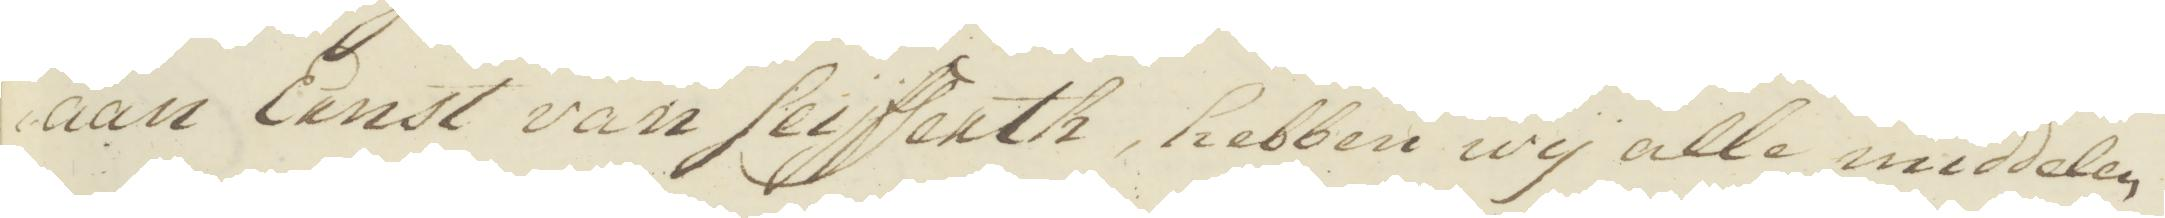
„aan Ernst van seijfferth, hebben wij alle middelen
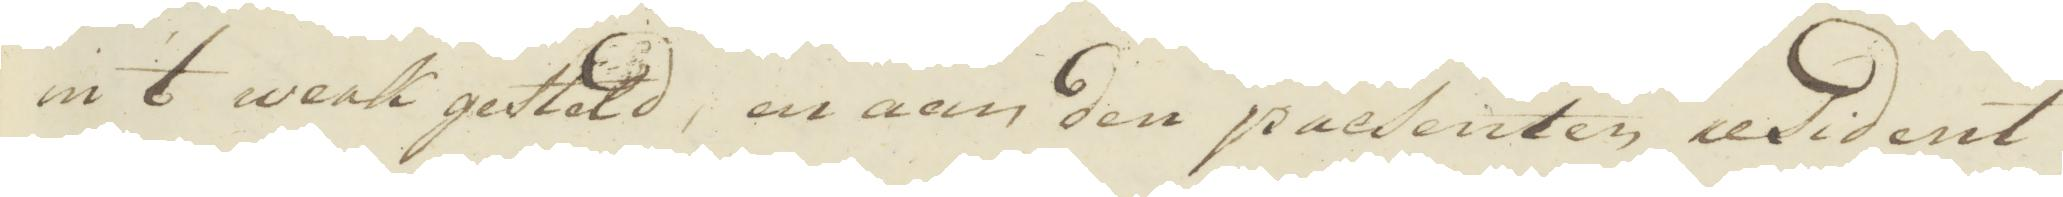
in ’t werk gesteld, en aan den presenten resident
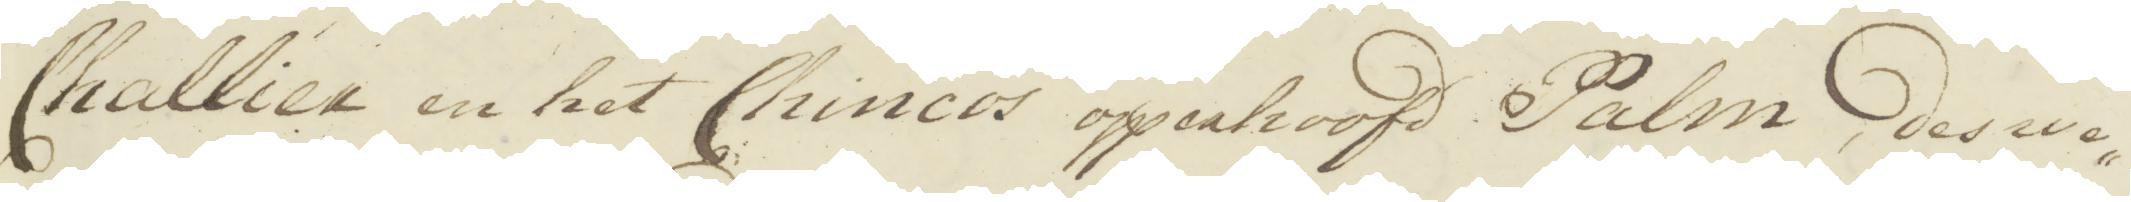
Challier en het Chrincos opperhoofd Palm, des we„
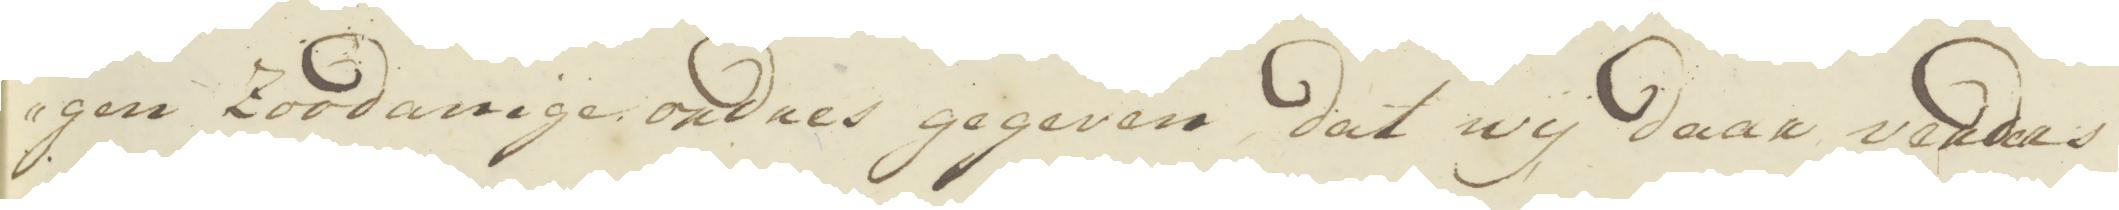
„gen zoodanige ordres gegeven dat wij daar verders
